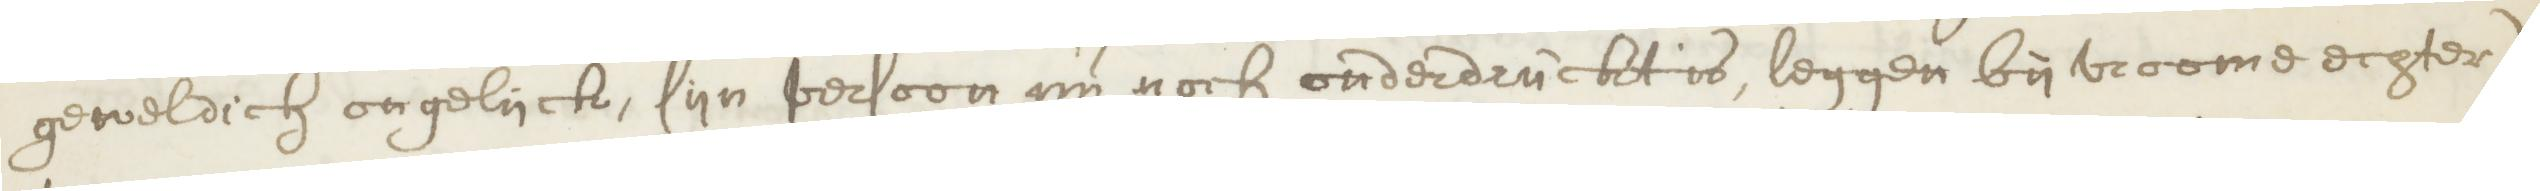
geweldich ongelijck, sijn persoon nu noch onderdruckt is, leggen bij vroome echter)
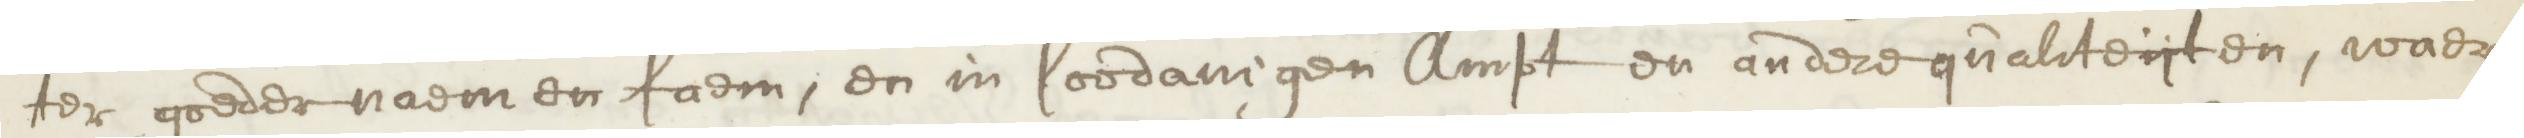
ter goeder naem en faem; en in soodanigen Ampt en andeze qualiteijten, waer
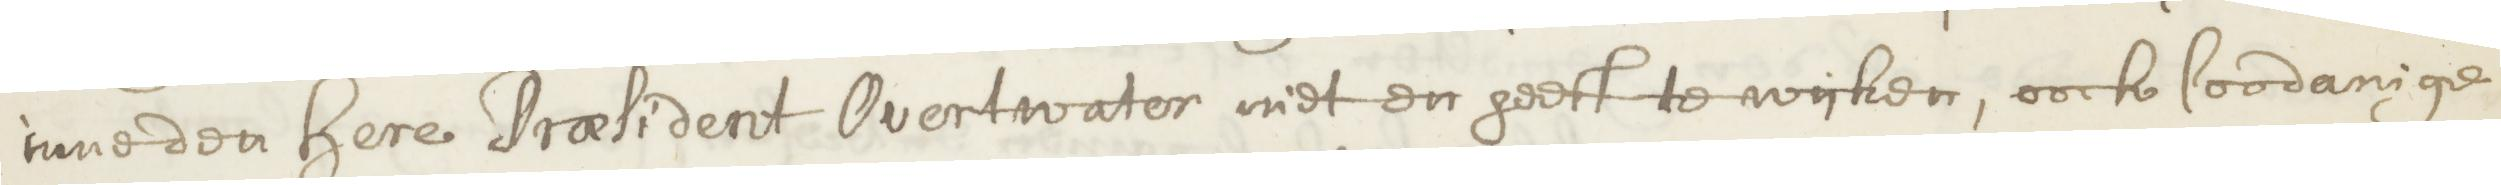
inne den here Praesident Overtwater niet en heeft te wijken, oock soodanige
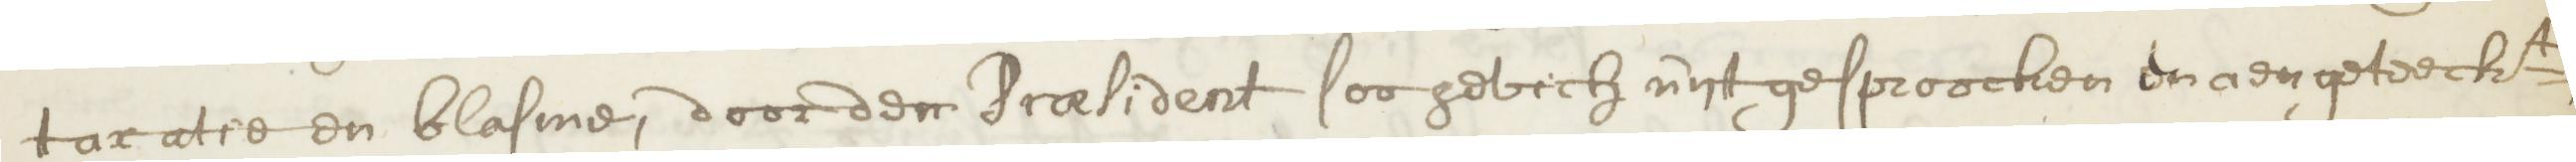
taxatie en blasme, door den Praesident soo hevich uyt gesproocken en aengeteeck=t
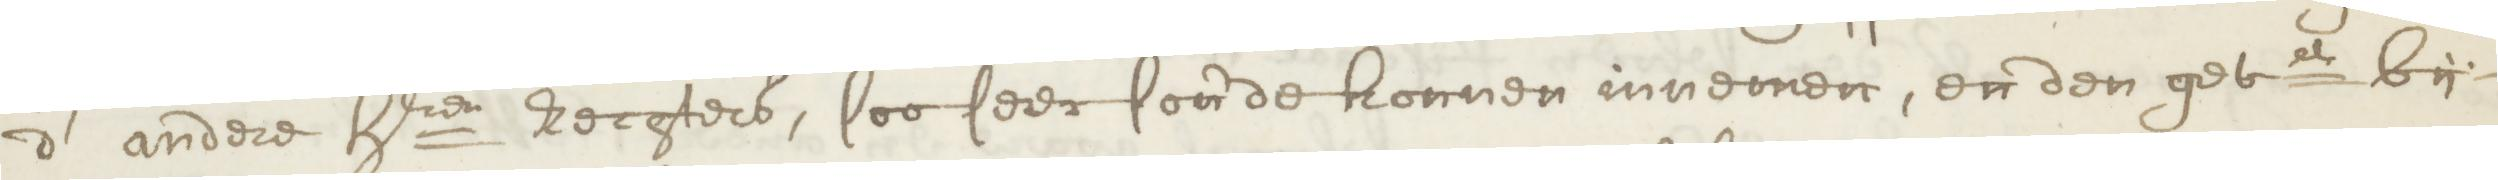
d’ andere H=ren rechters, soo seer soude konnen inne onder, en den gev=e bij
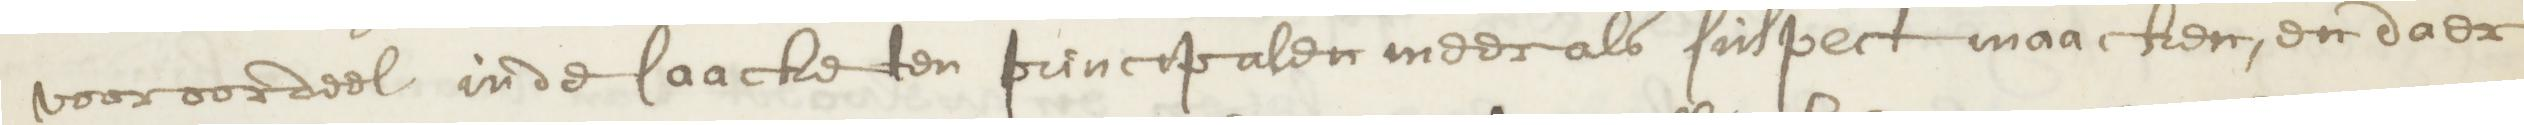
vooroordeel in de saacke ten principalen meer als suspect maacken, en daer
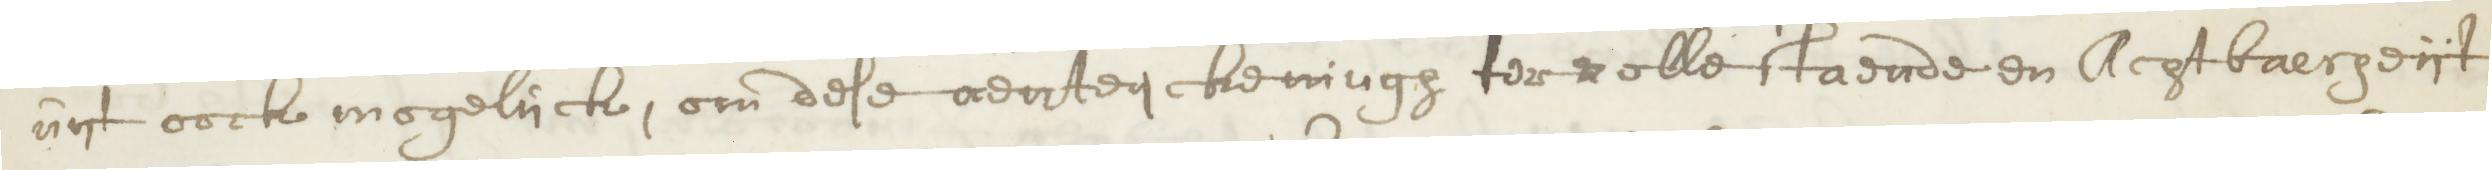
uyt oock mogelijck, om dese aenteijckeninge ter volle staende en Achtbaerheijt
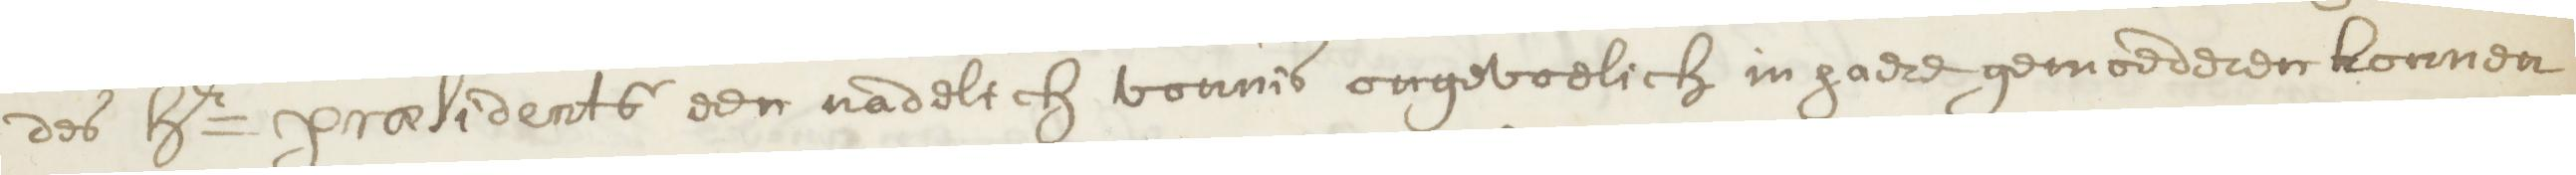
des h=r praesiderts een nadelich vornis ongevoelich in haere gemoederen konnen
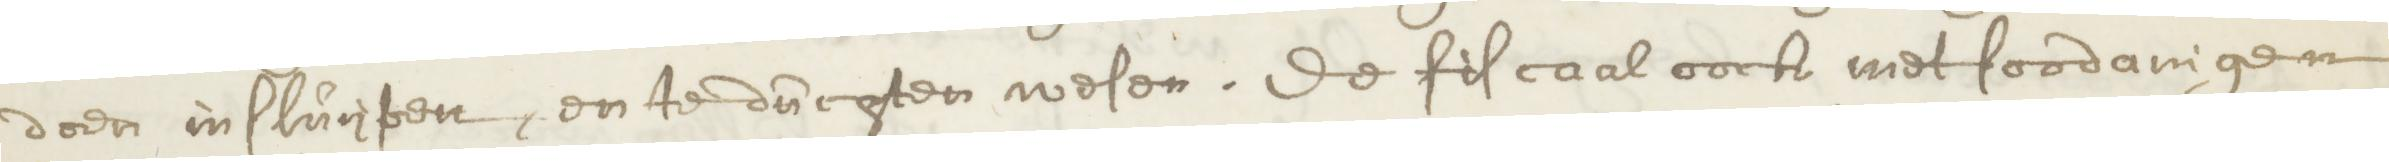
doen insluijpen, en te duchten wesen. De fiscaal oock met soodanigen
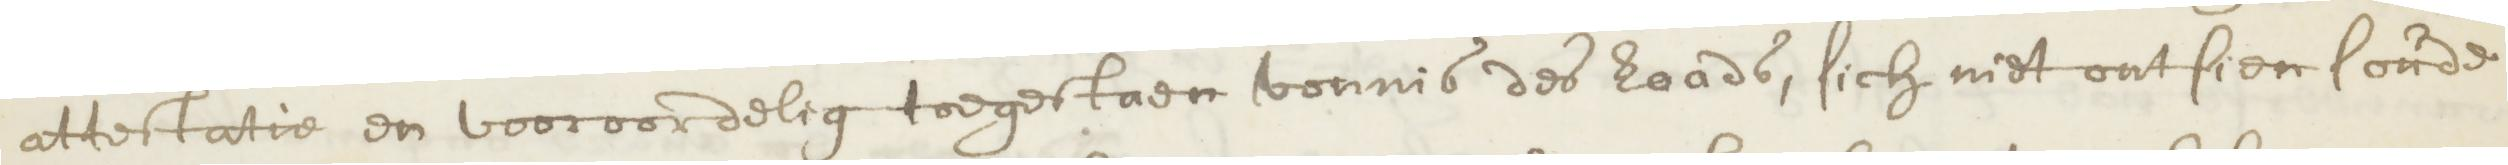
attestatie en vooroordelig toegestaen vonnis des raads, sich niet ontsien soude
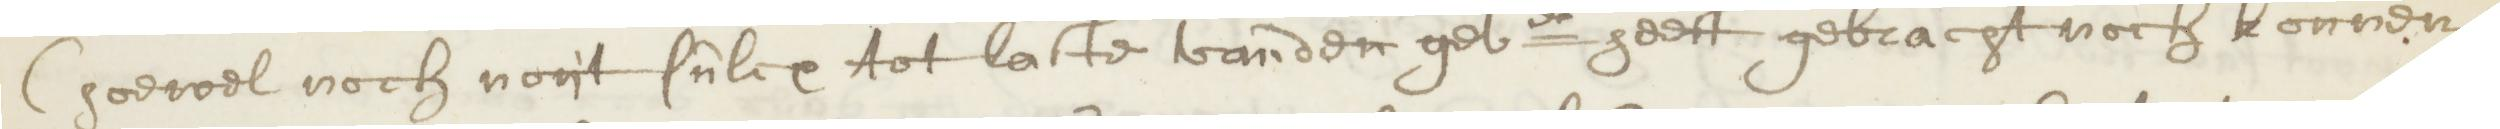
(hoewel noch noijt sulcx tot laste van den gev=e heeft gebracht noch konnen
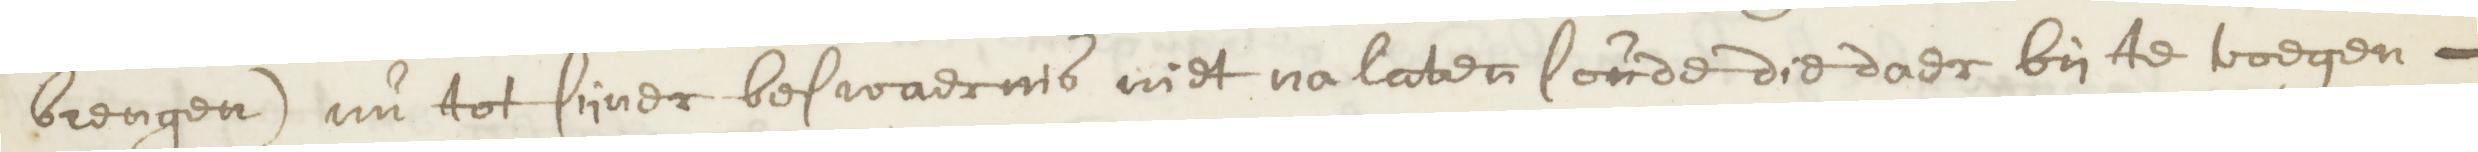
brengen) nu tot sijner beswaernis niet nalaten soude die daer bij te voegen —
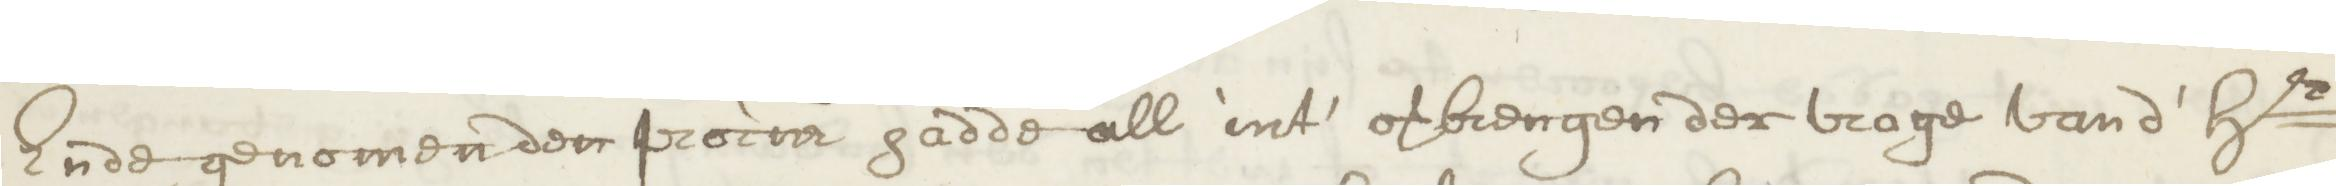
Ende genomen der procur hadde all int' overbrengen der vrage van d’ h=r
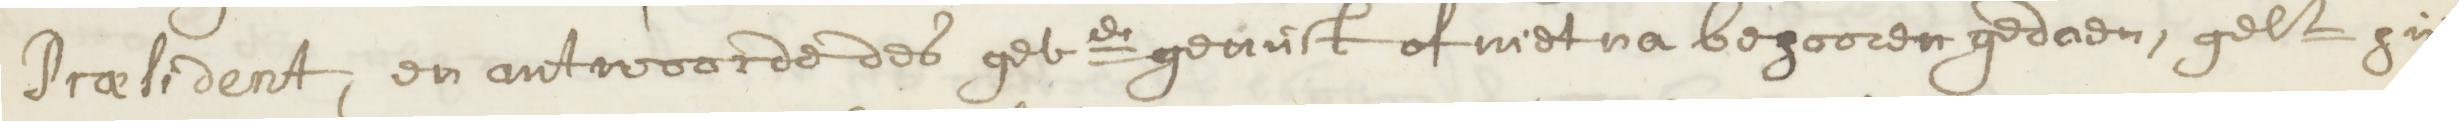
Praesident, en antwoorde des gev=e gerust of niet na behooren gedaen, gelijk hij
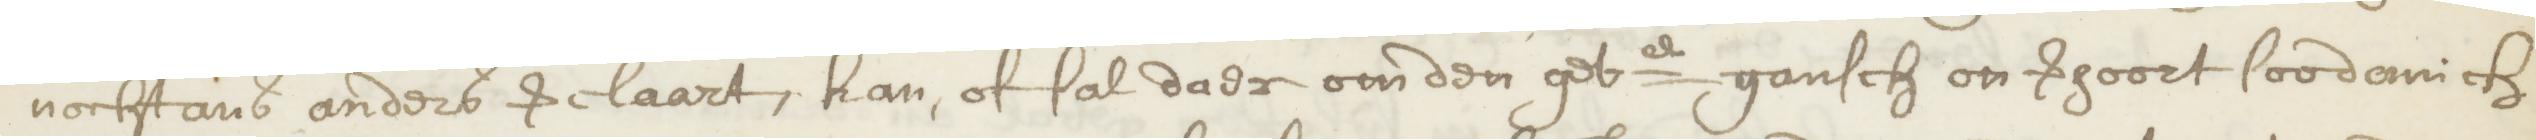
nochtans anders verclaart, kan, of sal daer om den gev=e gansch onverhoort soodanich
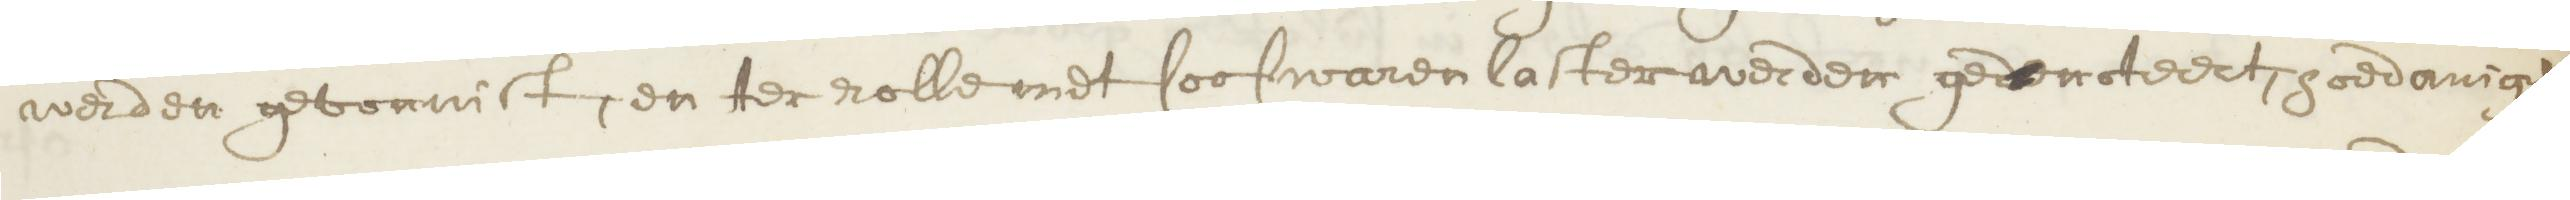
werden gevonnist, en ter rolle met soo swaren laster werden gedenoteert, hoedanigen
